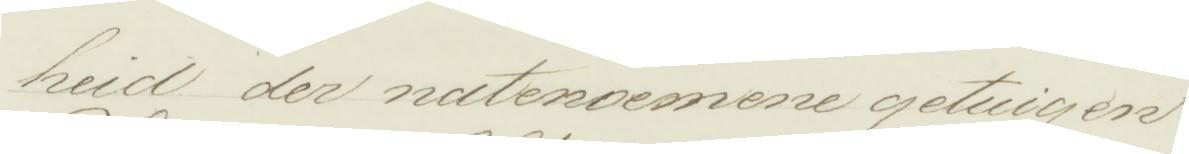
heid der natenoemene getuigen
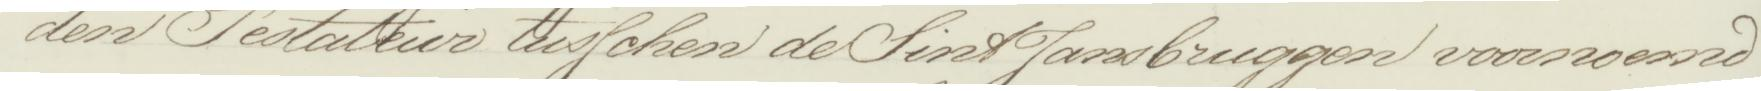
den Testateur tusschen de Sint Jansbruggen voornoemd
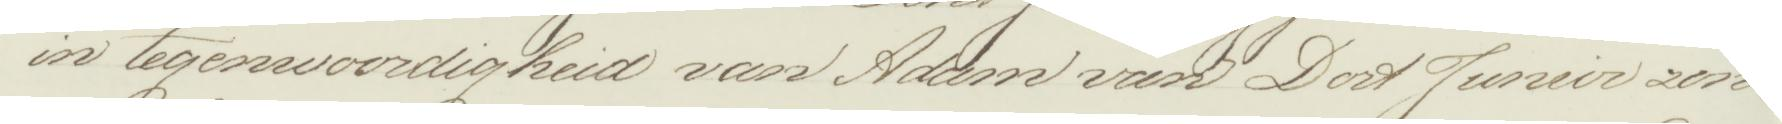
in tegenwoordigheid van Adam van Dort Junior zon
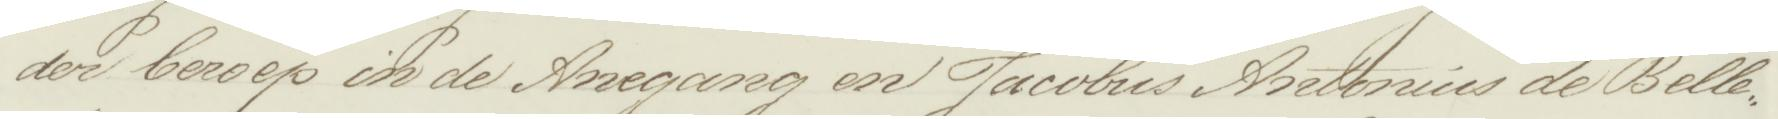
der beroep in de Anegang en Jacobus Antonius de Belle„
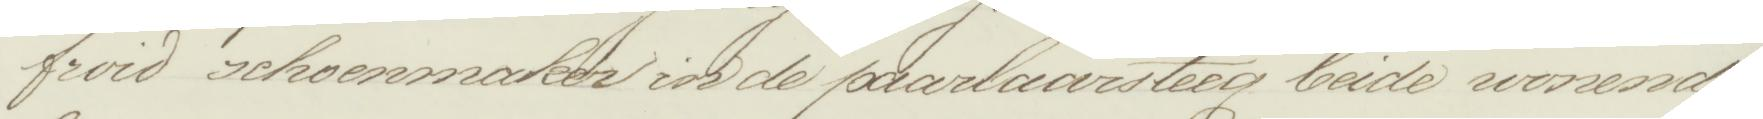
froid schoenmaker in de paarlaarsteeg beide wonende
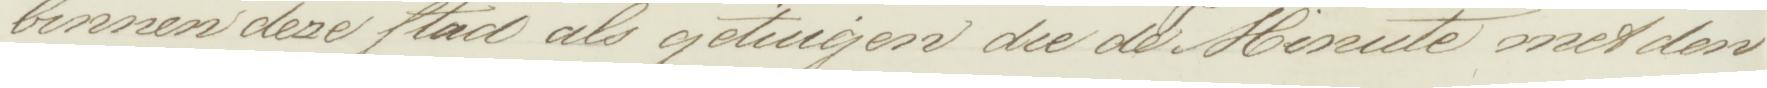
binnen deze stad als getuigen die de Minute met den
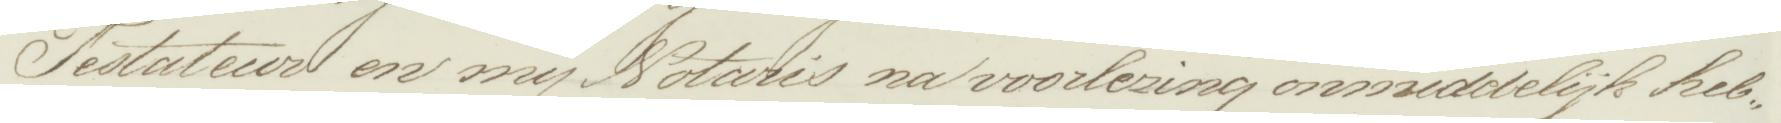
Testateur en mij Notaris na voorlezing onmiddelijk heb„
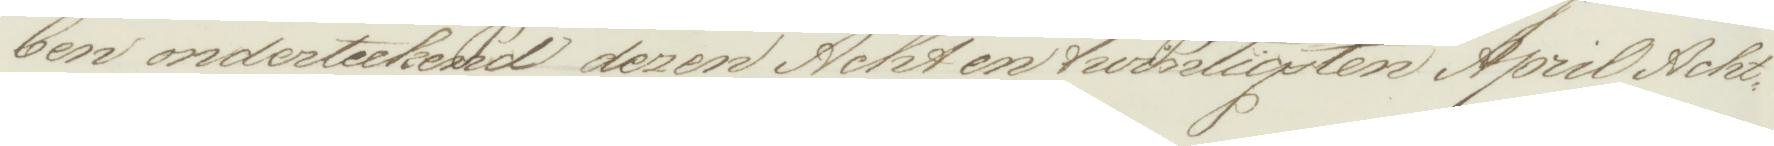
ben onderteekend dezen Acht en twintigsten April Acht„
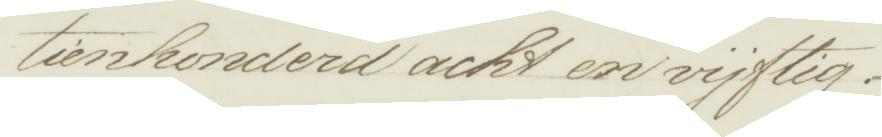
tienhonderd acht en vijftig.
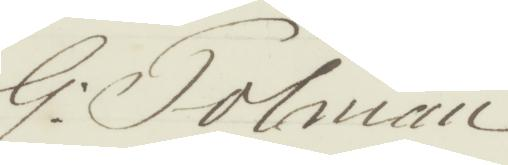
G: Polman
